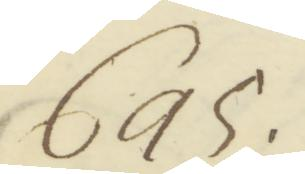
695.
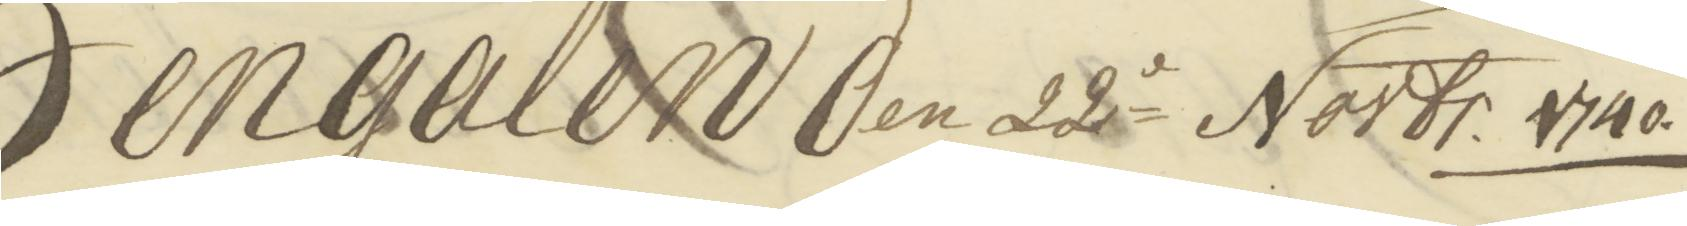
Van Bengalen den 22=e Novbr. 1740.
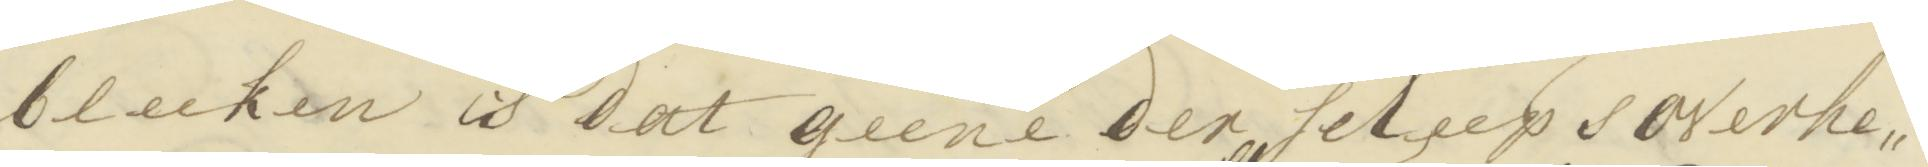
gebleeken is dat geene der scheeps overhe„
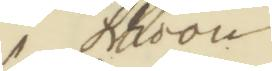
^schoon
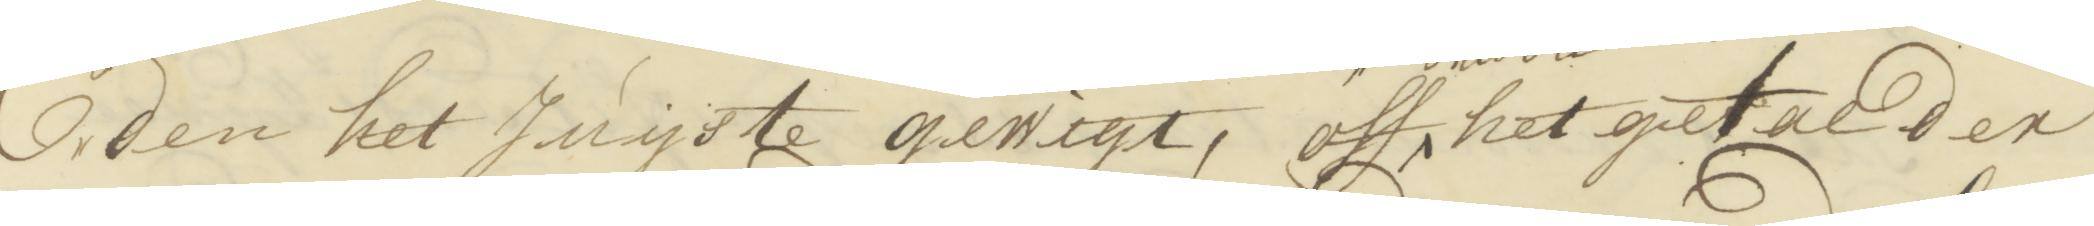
den het Juijste gewigt, off ^ het getal der
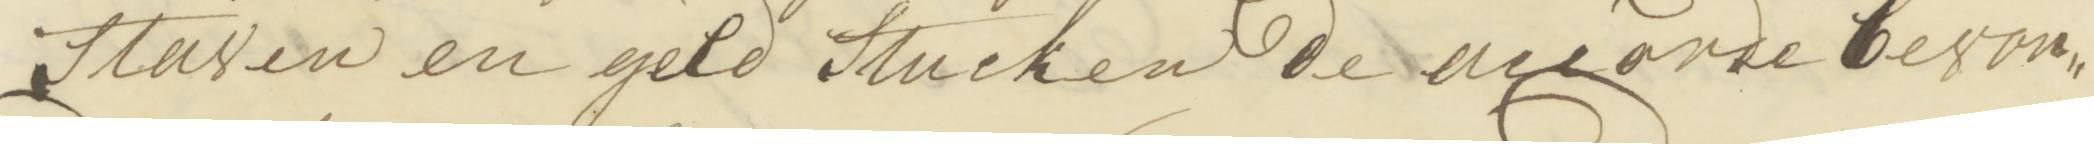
staven en geld stucken de accorde bevon„
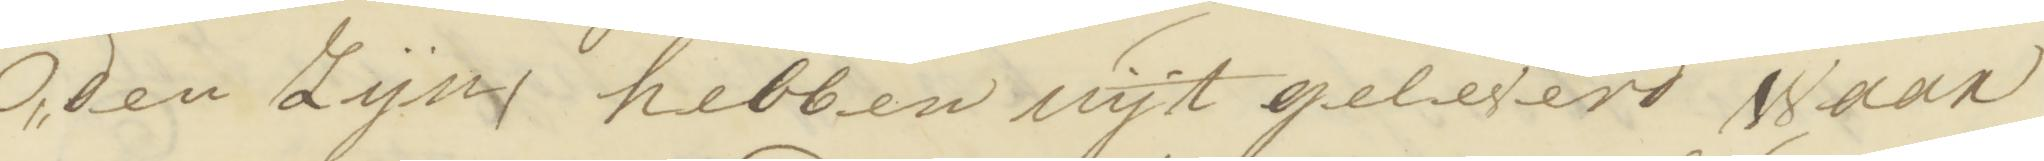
„den zijn, hebben uijt geleverd waar
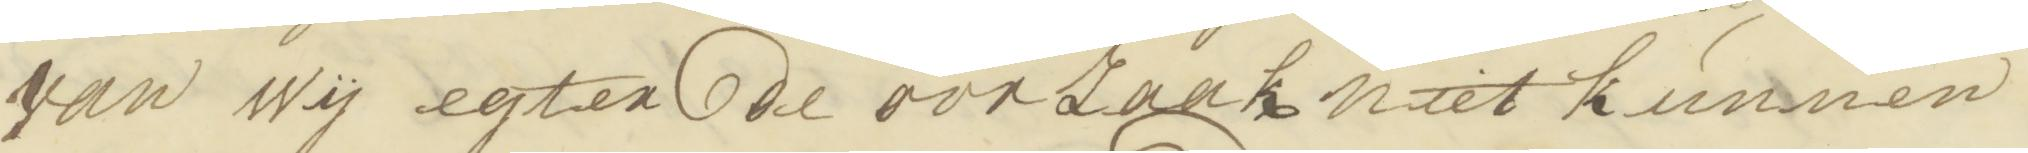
van wij egter de oorzaak niet kunnen
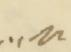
„n
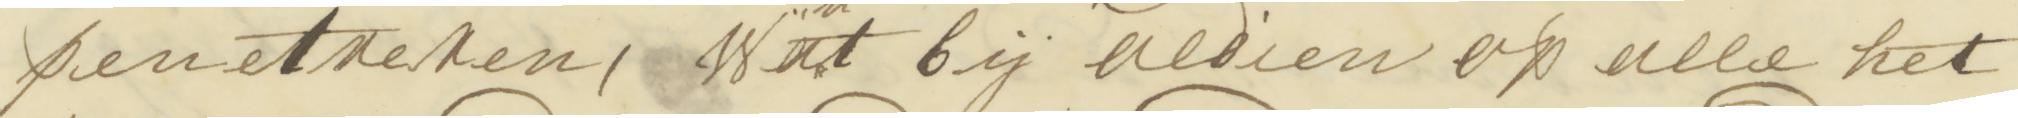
penetreren, wa„t bij aldien op alle het
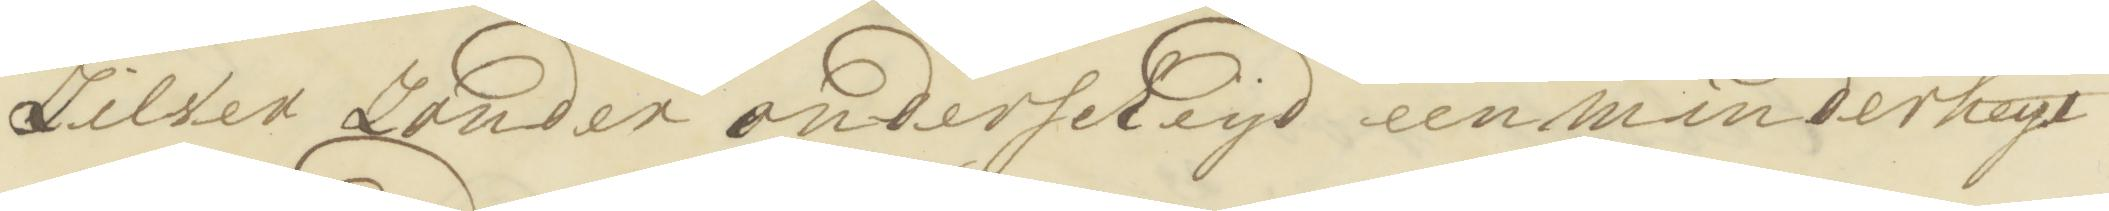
zilver zonder onderscheijd een minderheyt
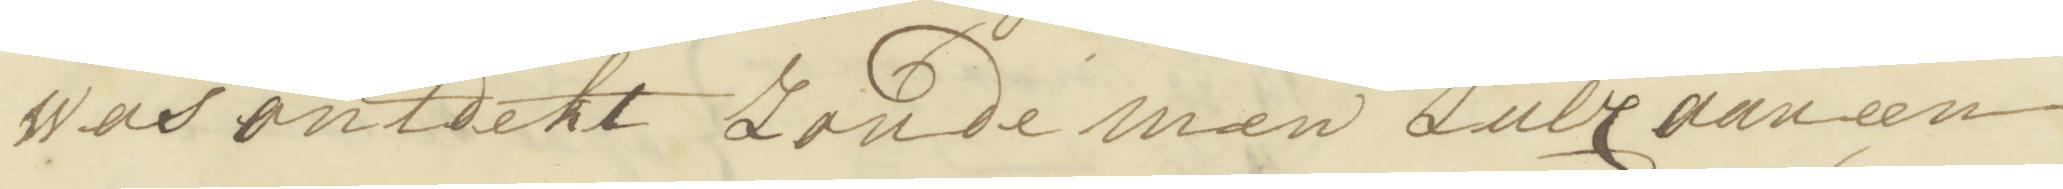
was ontdekt zoude men zulx aan een
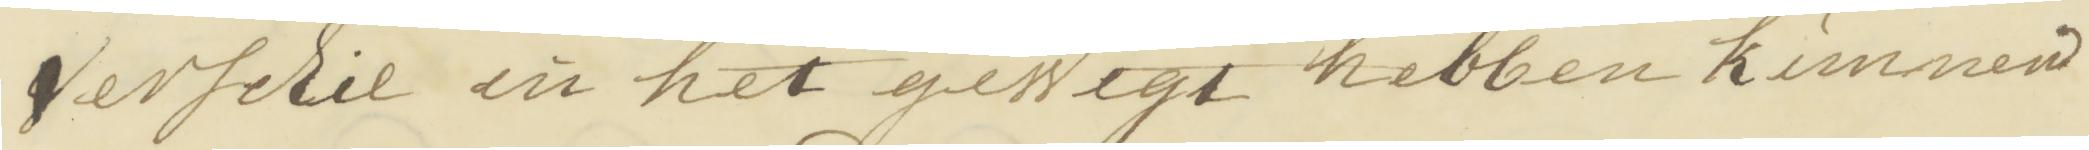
Verschil in het gewigt hebben kunnen
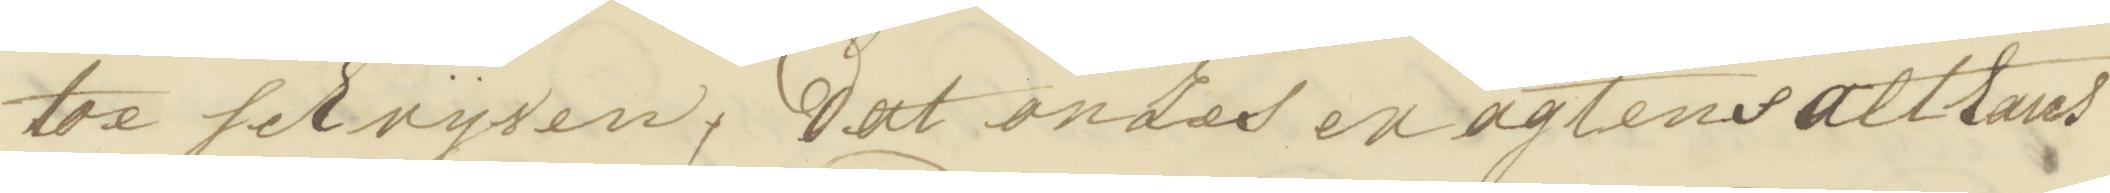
toe schrijven, dat onzes er agtens althans
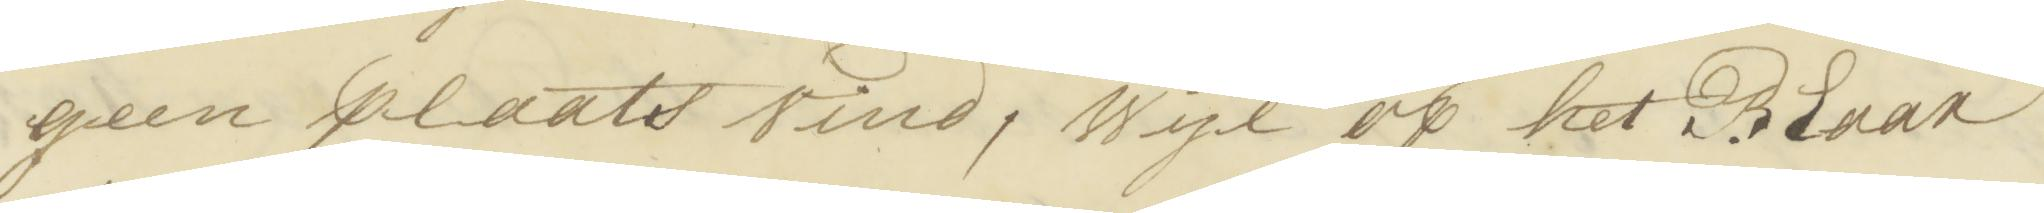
geen plaats vind, wijl op het Bhaar
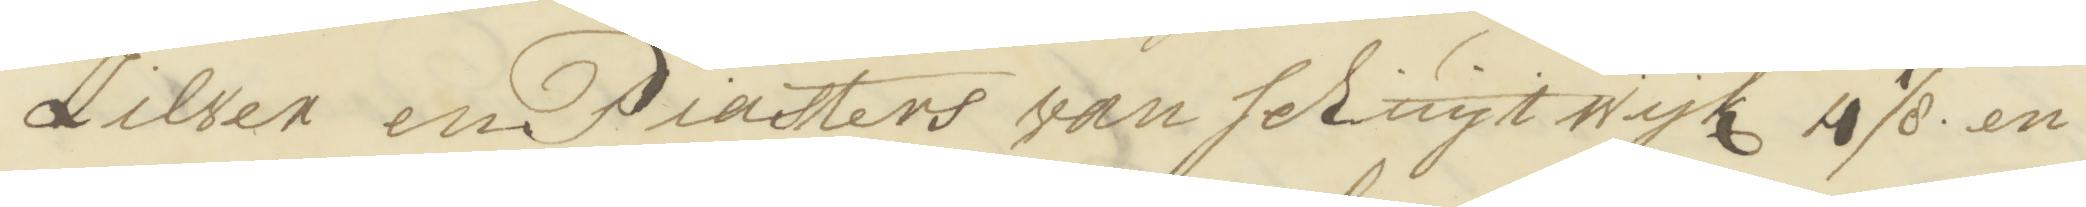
zilver en Piasters van schuijtwijk 4 1/8. en
